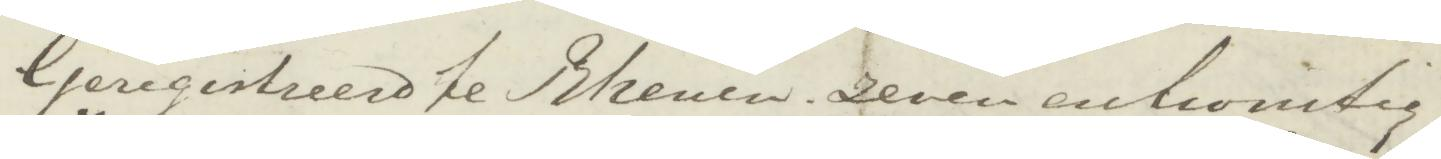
Geregistreerd te Rhenen. zeven en twintig
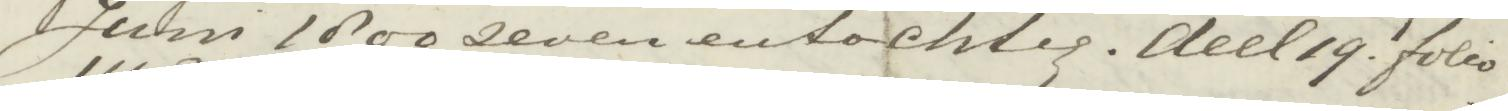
Juni 1800 zeven en tachtig. deel 19. folio
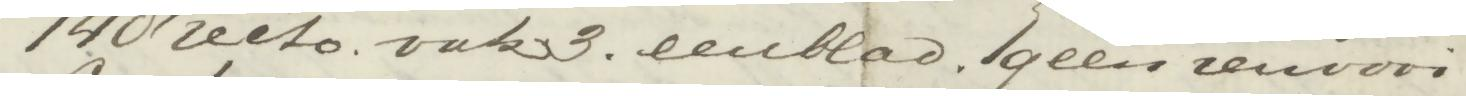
148 recto. vak 3. een blad, geen renvooi
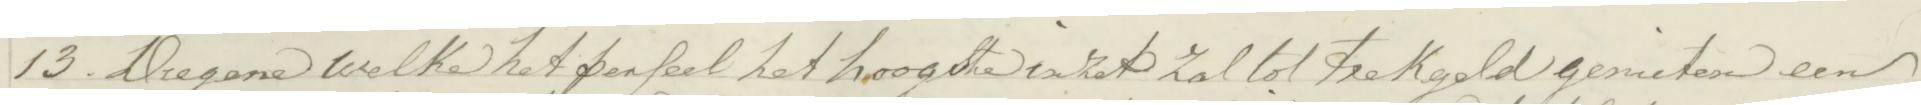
13. Diegene welke het perceel het hoogste inzet zal tot trekgeld genieten een
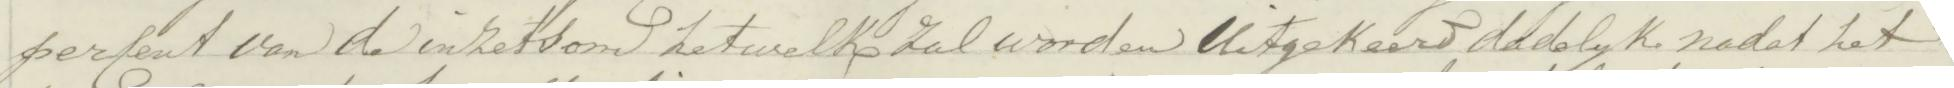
percent van de inzetsom hetwelk zal worden Uitgekeerd dadelijk nadat het
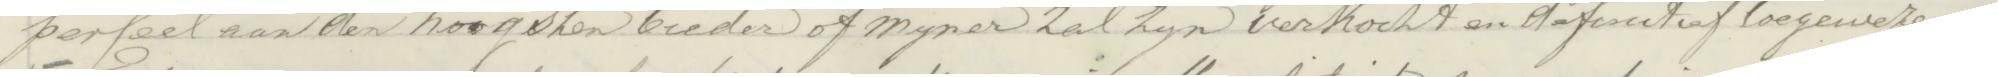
perceel aan den hoogsten bieder of myner zal zyn verkocht en definitief toegewezen
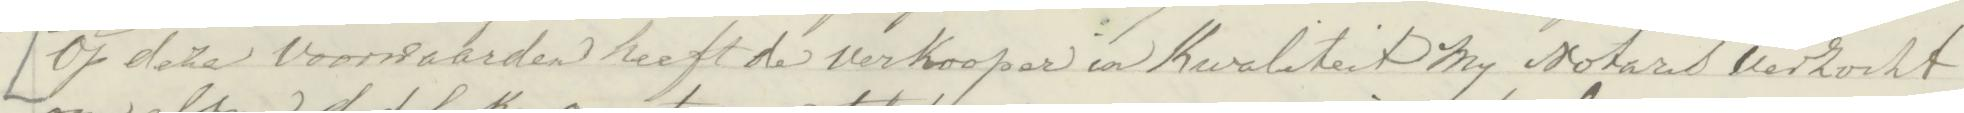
Op deze voorwaarden heeft de verkooper in kwaliteit my Notaris verzocht
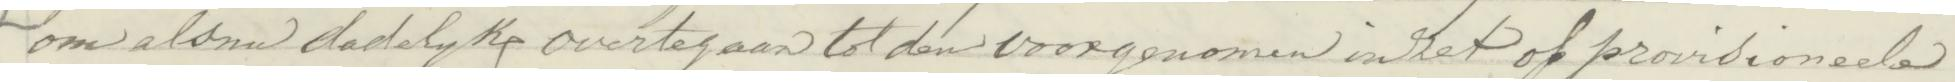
om alsnu dadelyk overtegaan tot den voorgenomen inzet of provisioneele
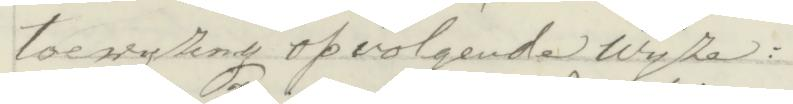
toewyzing op volgende wijze:
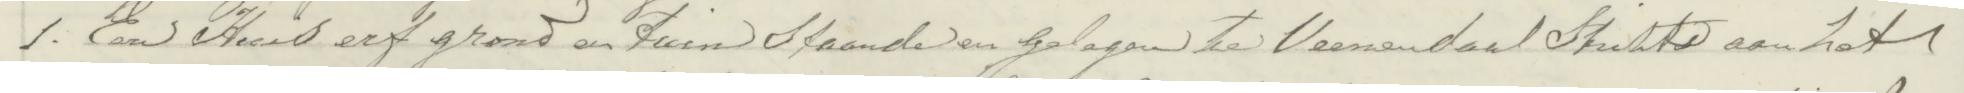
1: Een Huis erf grond en tuin staande en gelegen te Veenendaal Stichts aan het
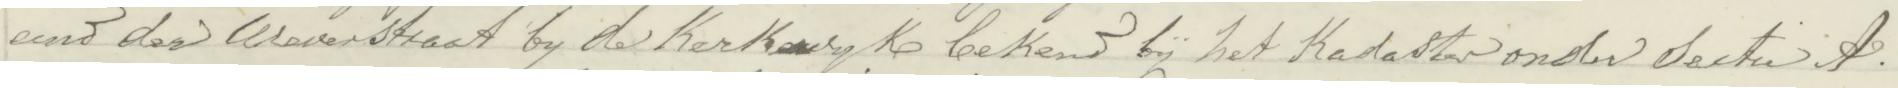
eind der Weverstraat by de Kerkewyk bekend bij het Kadaster onder Sectie A.
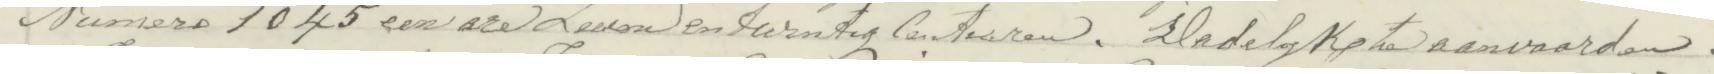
Numero 1045 een are Zeven en twintig Centiaren. Dadelyk te aanvaarden.
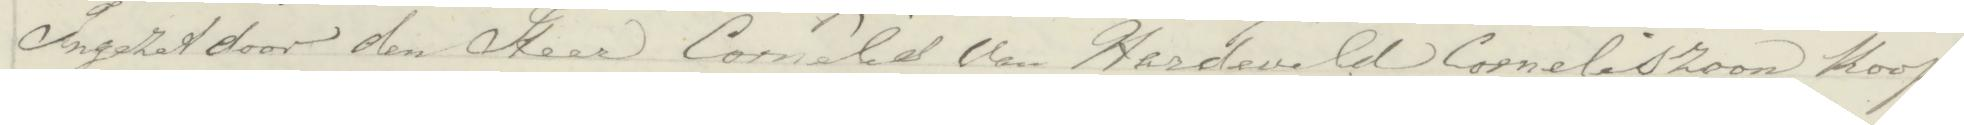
Ingezet door den Heer Cornelis van Hardeveld Corneliszoon koop
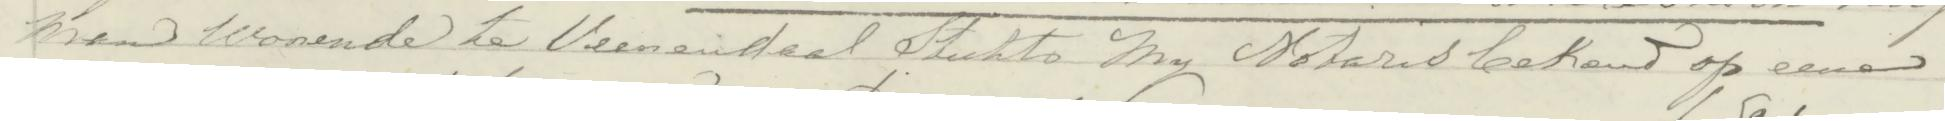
man wonende te Veenendaal Stichts my Notaris bekend op eene
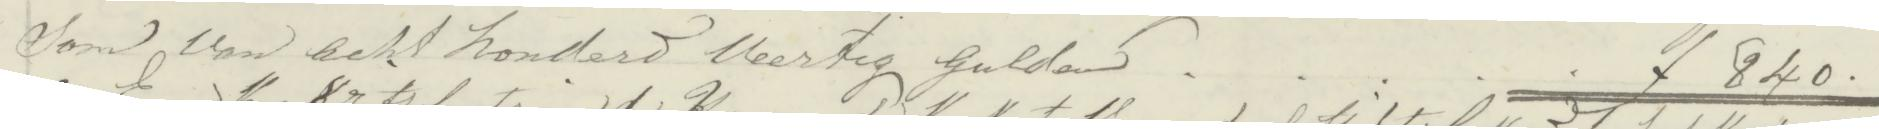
som van acht honderd veertig Gulden - - - - - ƒ 840.
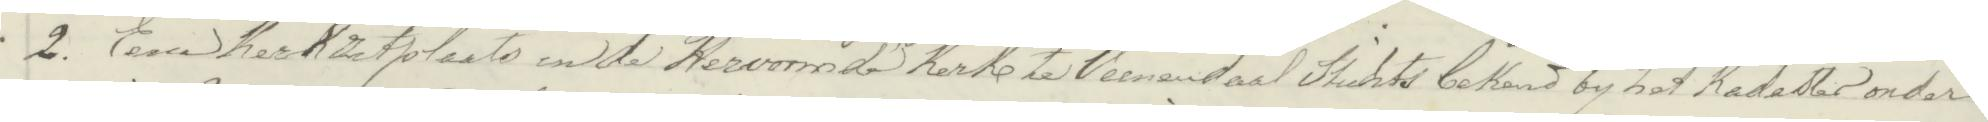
2. Eene kerkzitplaats in de Hervormde kerk te Veenendaal Stichts bekend by het Kadaster onder
